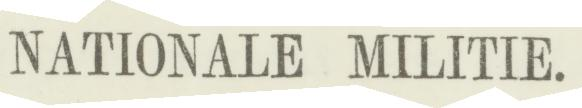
nationale militie
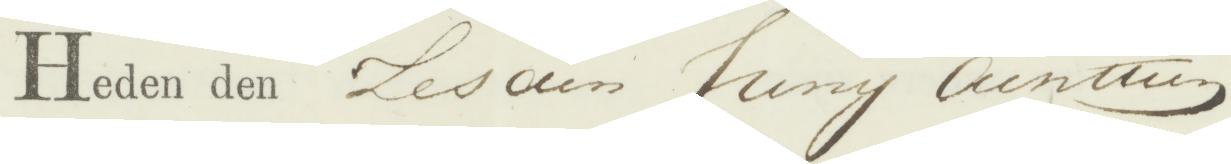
Heden den Zesden Juny Achttien
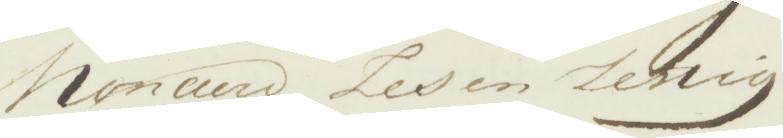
Honderd Zes en zestig
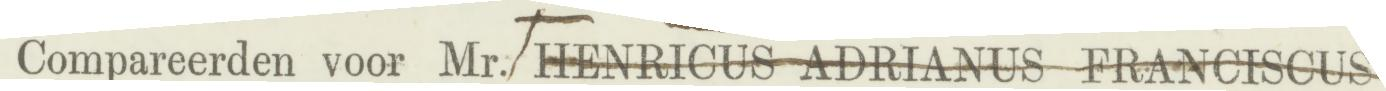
Compareerden voor Mr. ¶ henricus adrianus franciscus
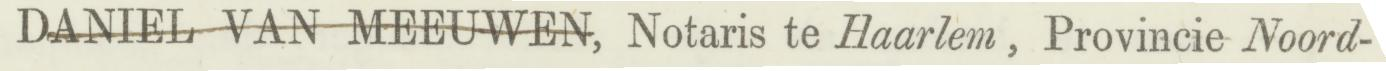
daniel van meeuwen, Notaris te Haarlem, Provincie Noord-
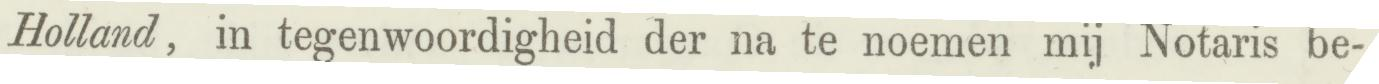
Holland, in tegenwoordigheid der na te noemen mij Notaris be-
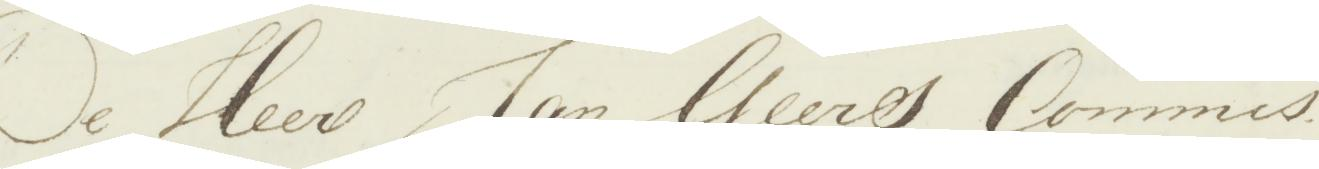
De Heer Jan Geers Commis
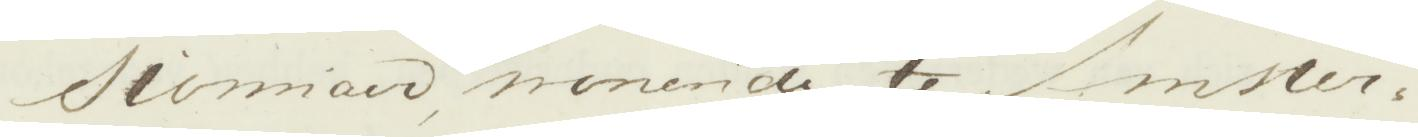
sionair, wonende te Amster„
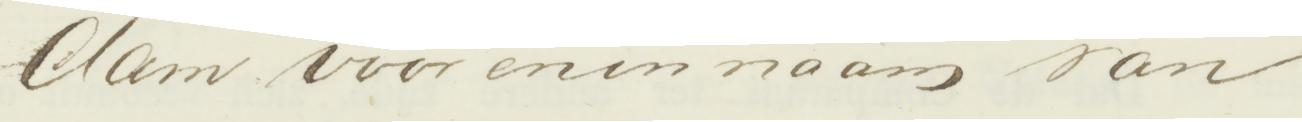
dam, voor enin naam van
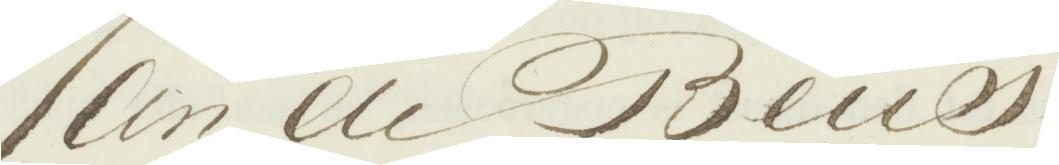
Jan de Beus
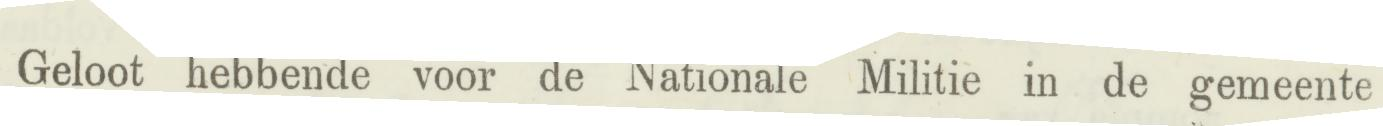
Geloot hebbende voor de Nationale Militie in de gemeente
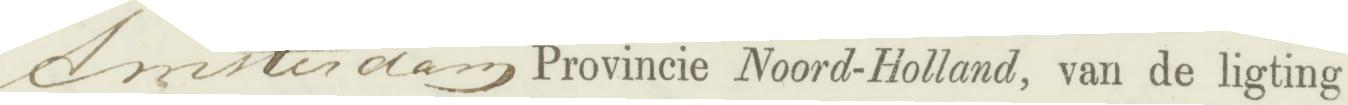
Amsterdam Provincie Noord-Holland, van de ligting
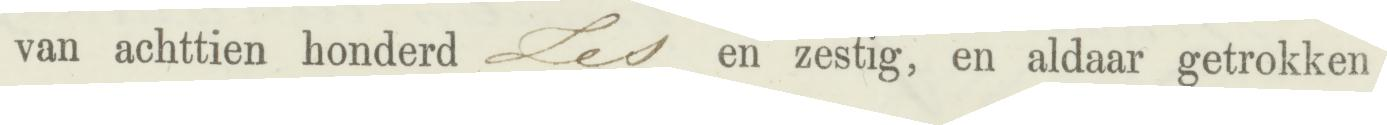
van achttien honderd Zes en zestig, en aldaar getrokken
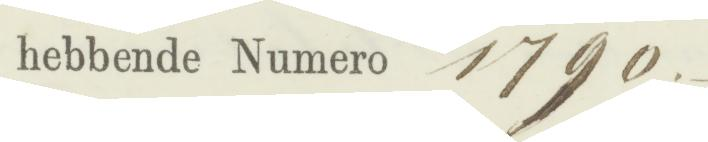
hebbende Numero 1790.
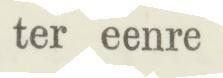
ter eenre
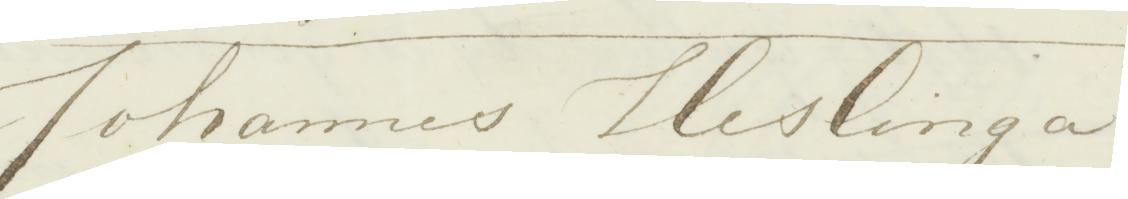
Johannes Heslinga
